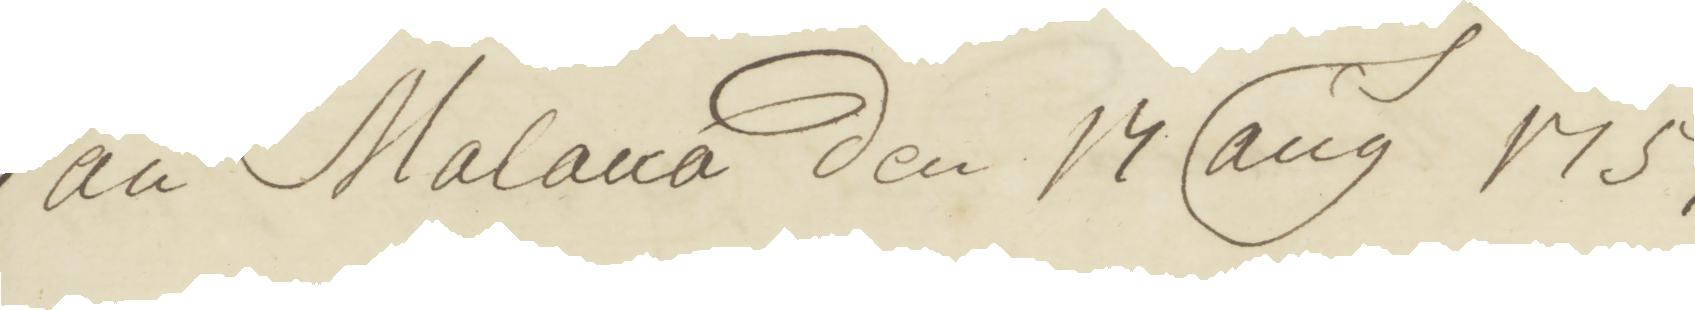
Van Malacca den 17 augs 175
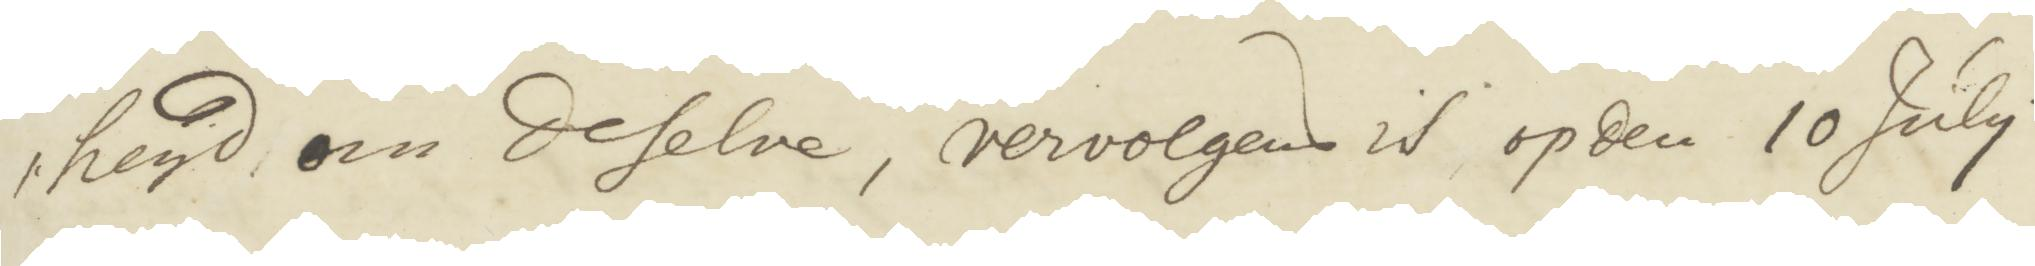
„heijd om deselve, vervolgens is op den 10 July
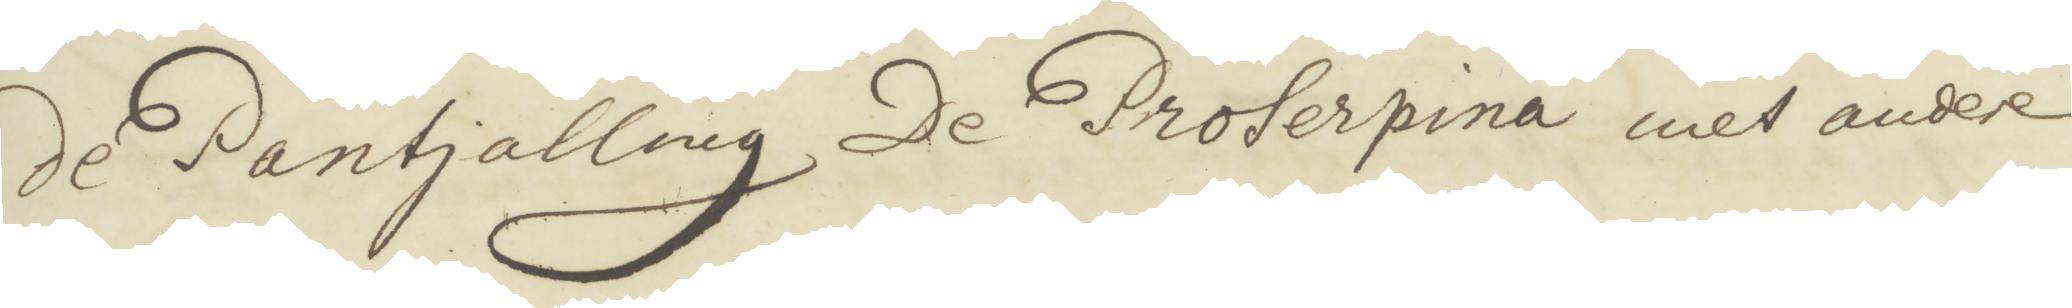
de Pantjalling De Proserpina met andere
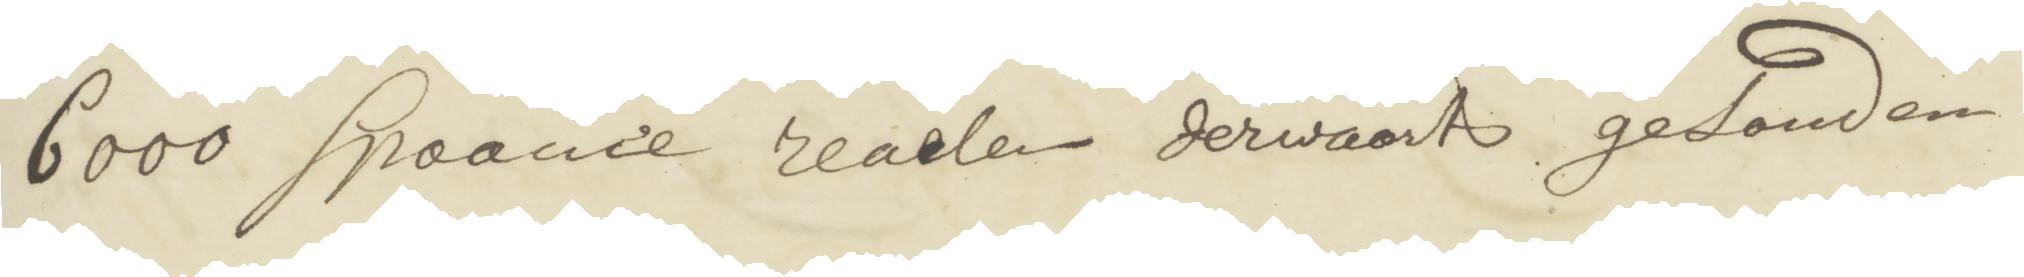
6000 spaance realen derwaarts gesonden,
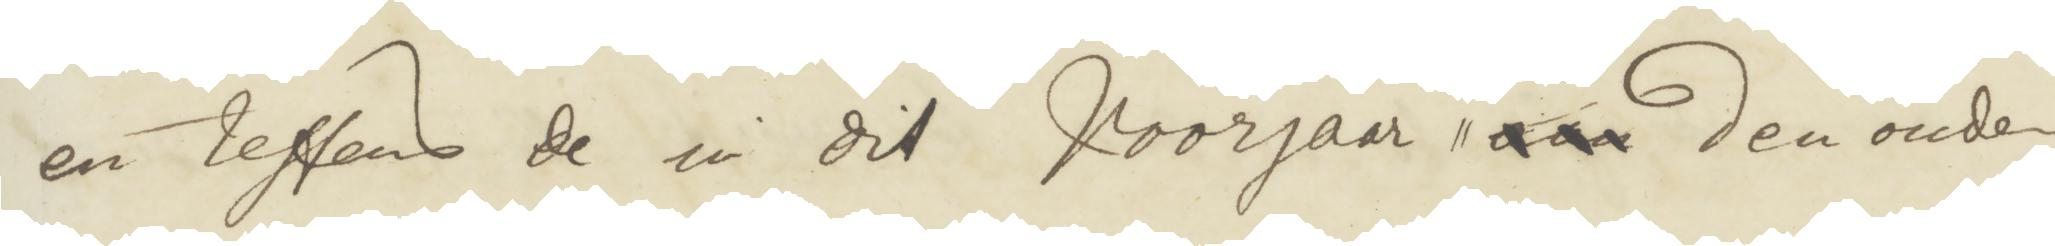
en teffens de in dit voorjaar aan den oude
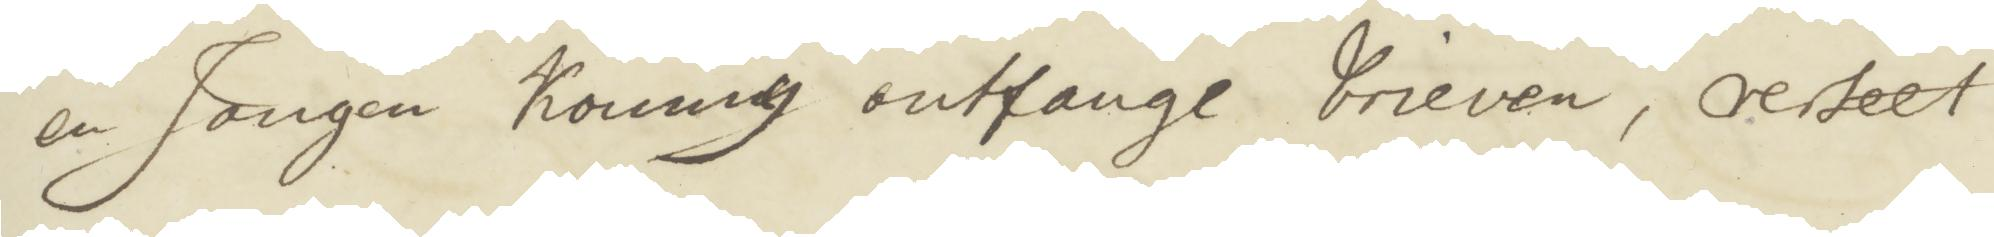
en Jongen koning ontfange brieven, verselt
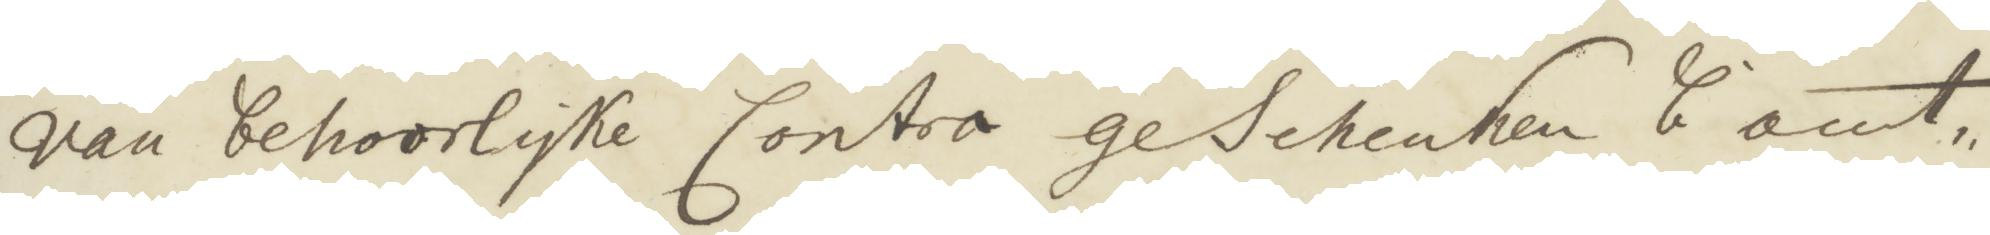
van behoorlijke Contra geschenken b'ant„
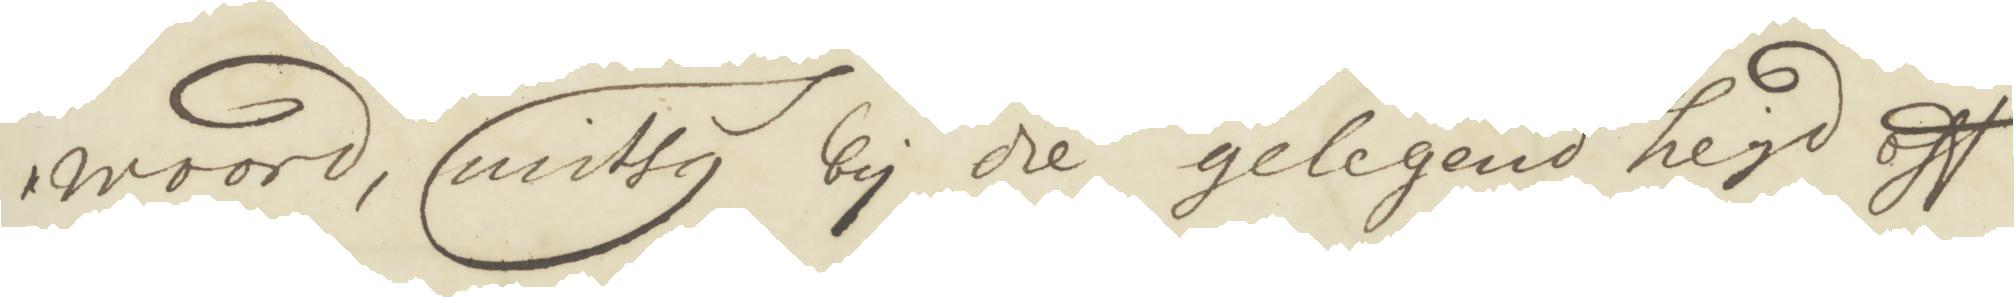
„woord, mitsgs bij die gelegendheijd off
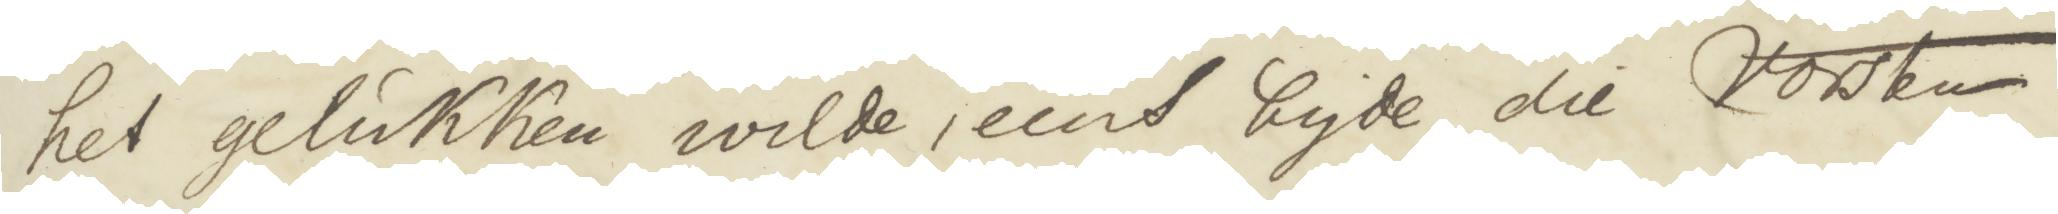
het gelukken wilde, eens bijde die vorsten
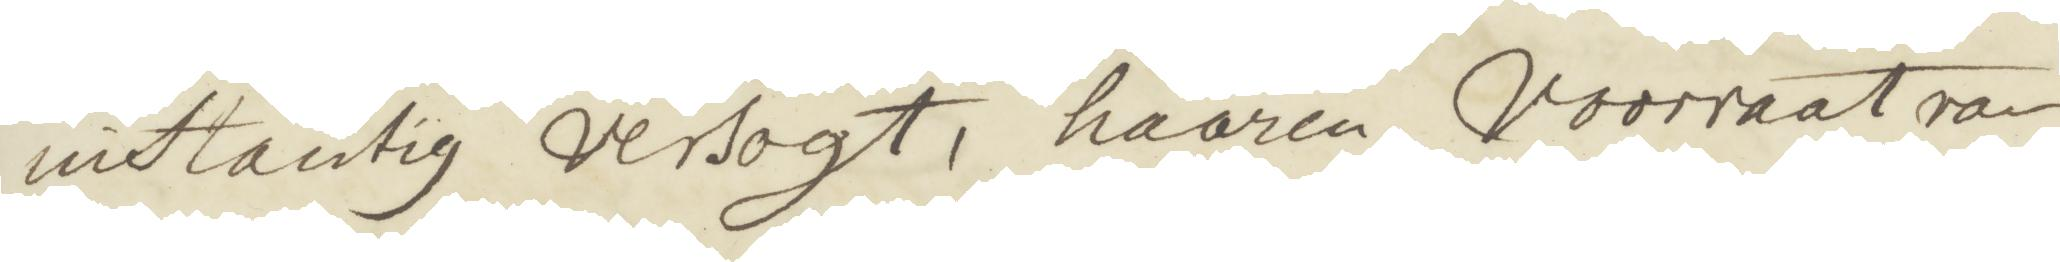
instantig versogt, haaren voorraat van
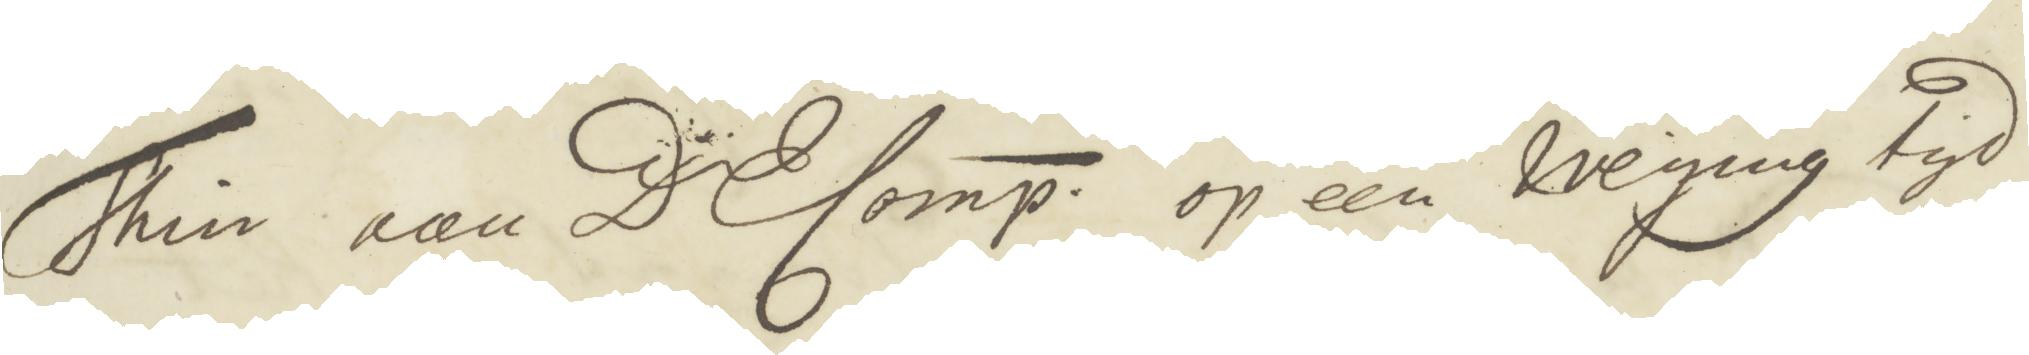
Thin aan D E Comp. op een weging tijd
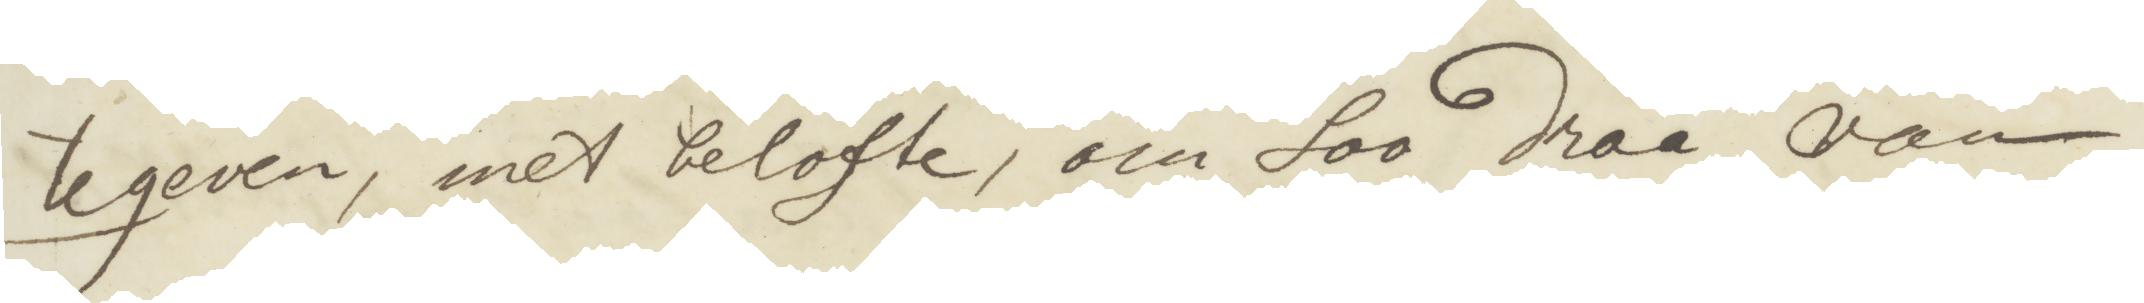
te geven, met belofte, om soo draa van
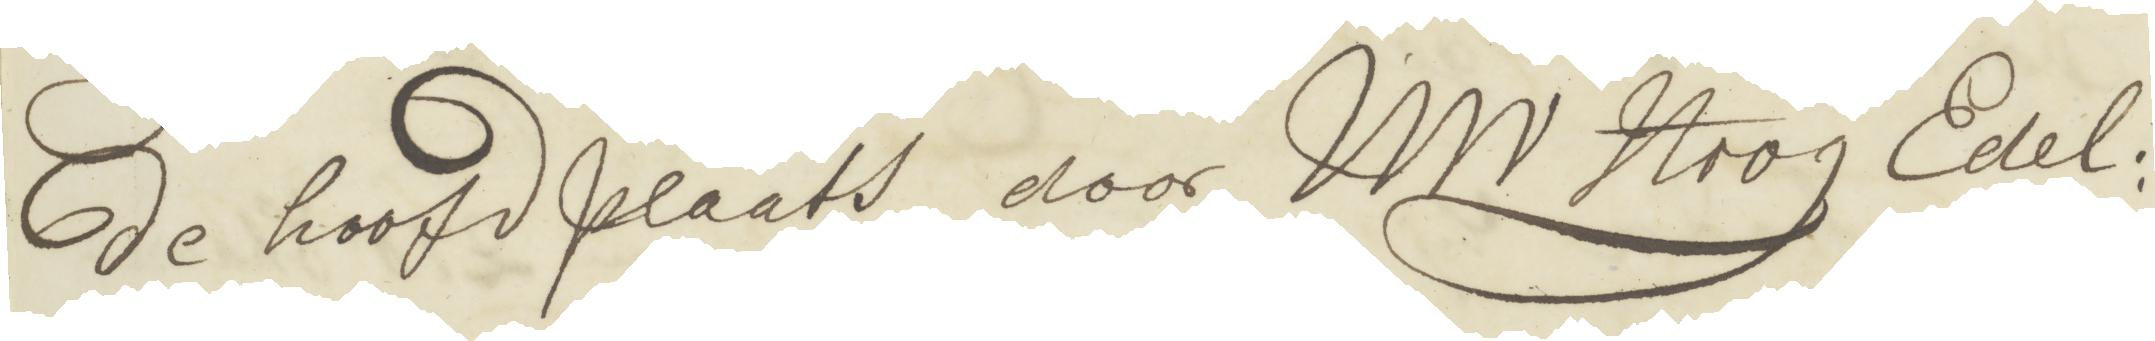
de hoofdplaats door UW Hoog Edel:
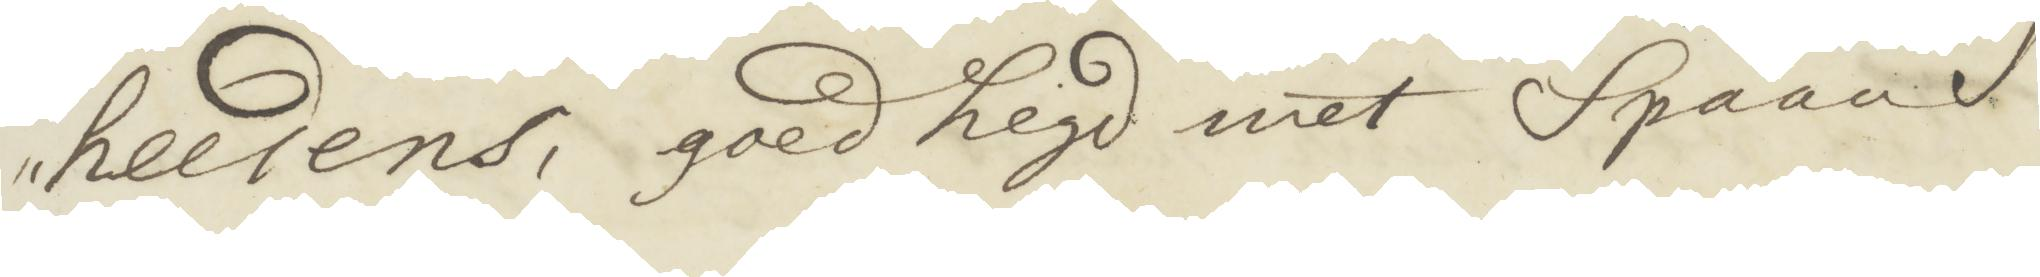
„heedens, goedheijd met spaans
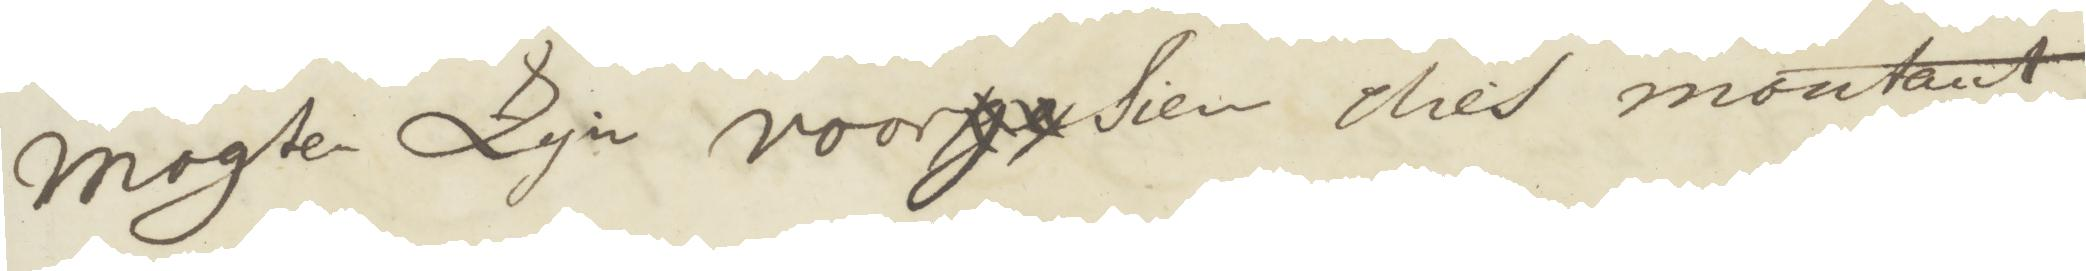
mogte zijn voorgesien dies montant
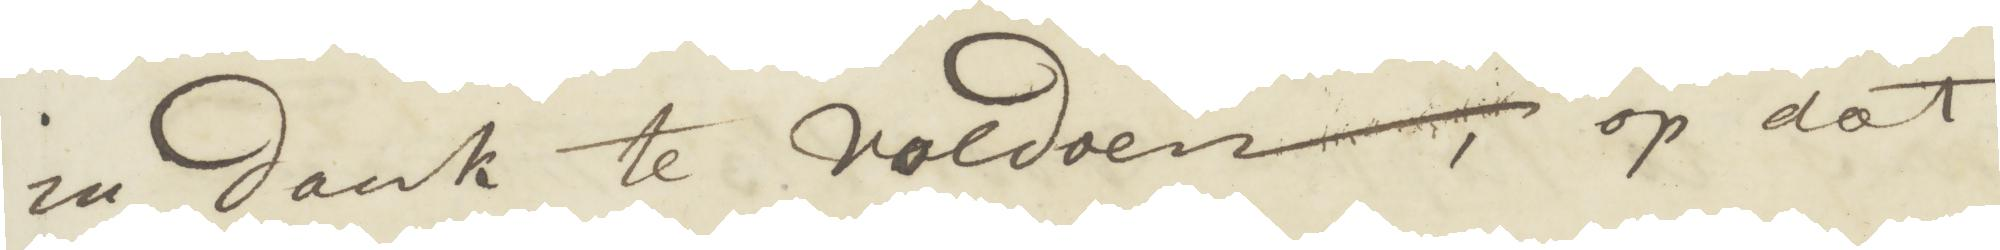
in dank te voldoen, op dat
